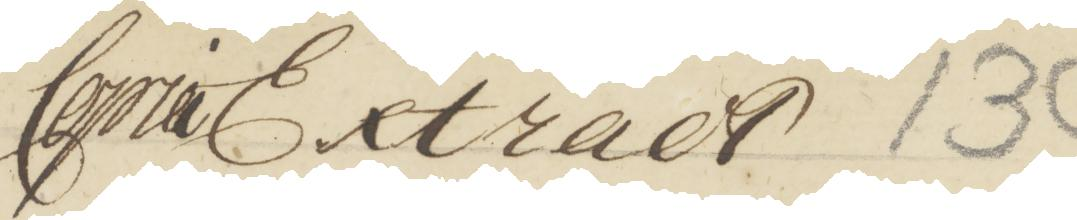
Copia Extract 13
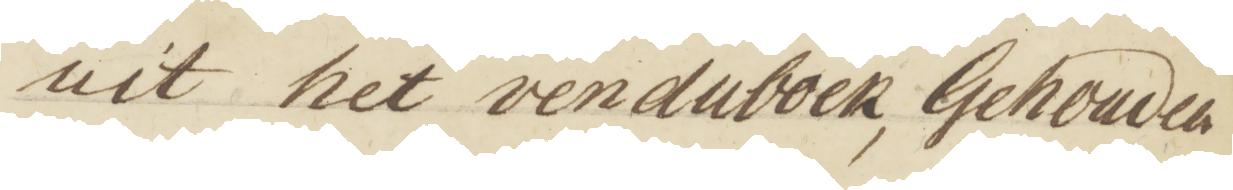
uit het venduboek, Gehouden
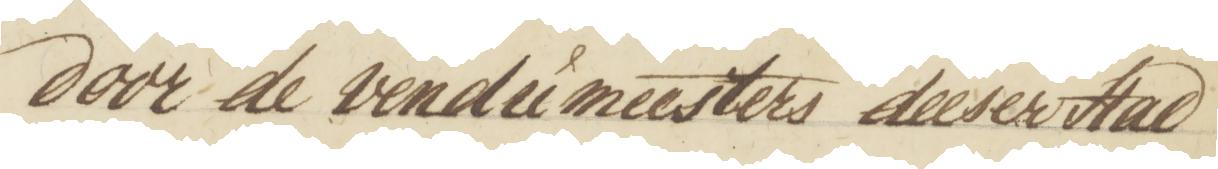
door de vendumeesters deeser stad
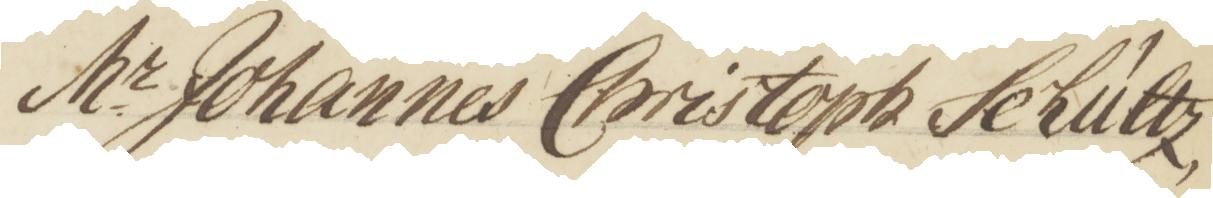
M-r Johannes Christoph Schultz,
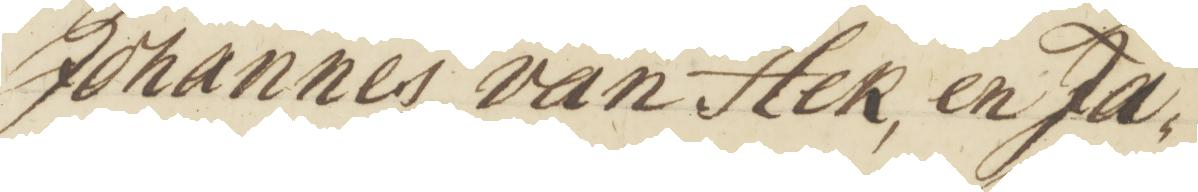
Johannes van Hek, en Ja„
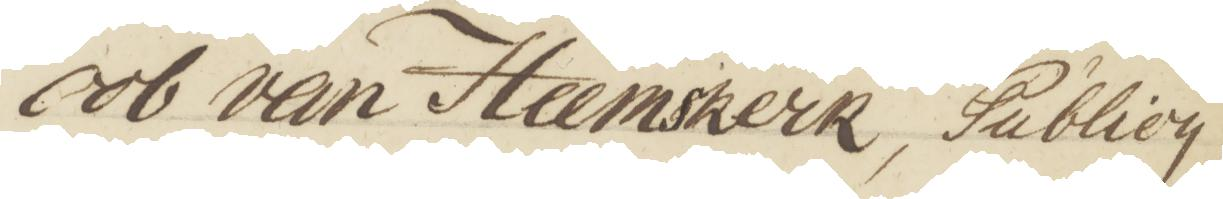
cob van Heemskerk, Publieq
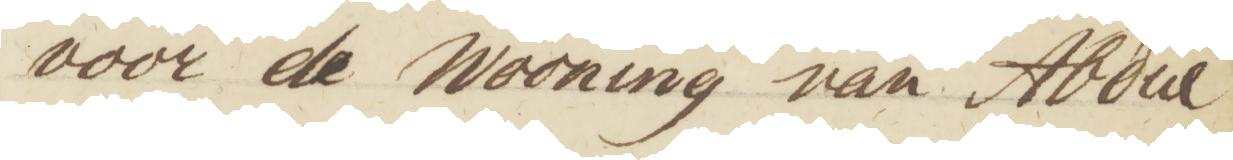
voor de wooning van Abdul
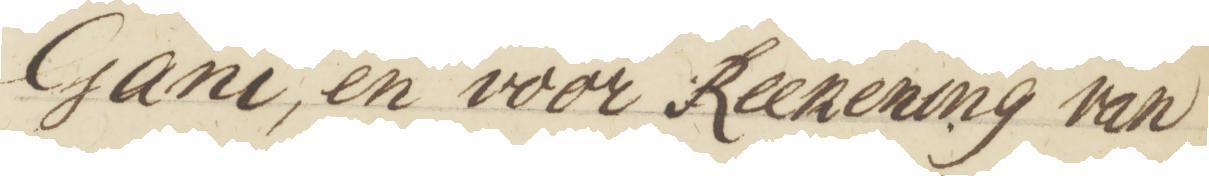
Gani, en voor Reekening van
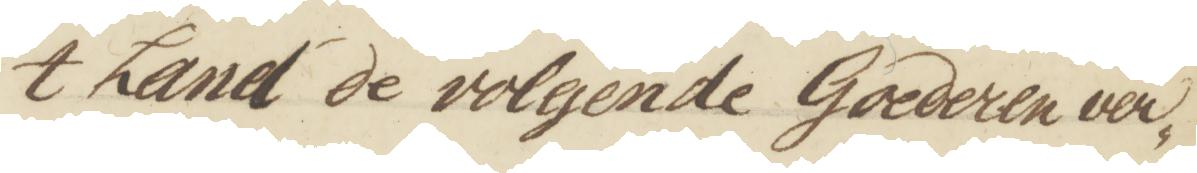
t Land de volgende Goederen ver„
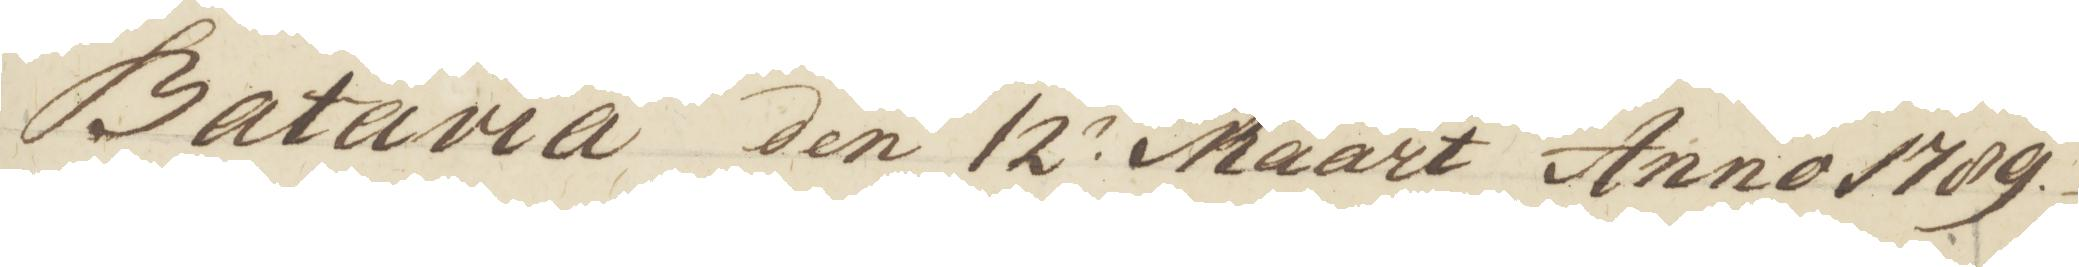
Batavia den 12.' Maart Anno 1789.
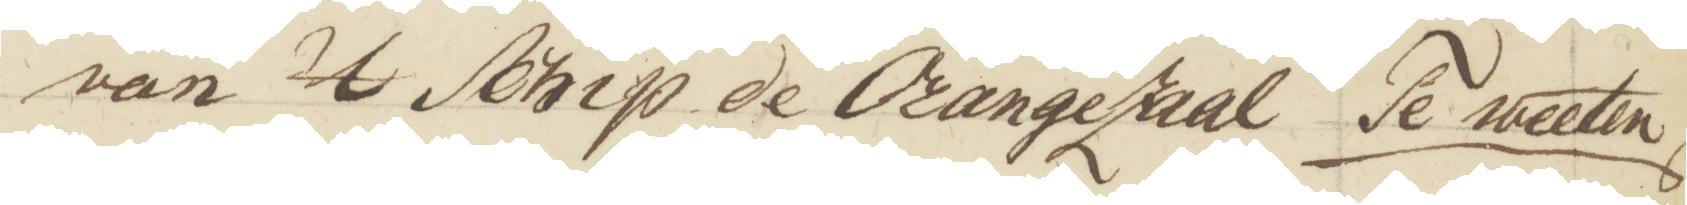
van ’t schip de OrangeZaal Te weeten
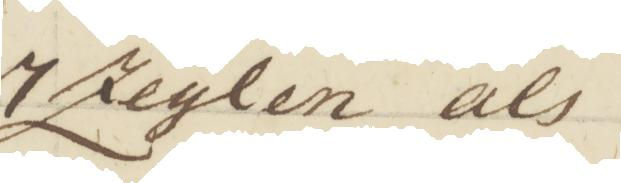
7 Zeylen als
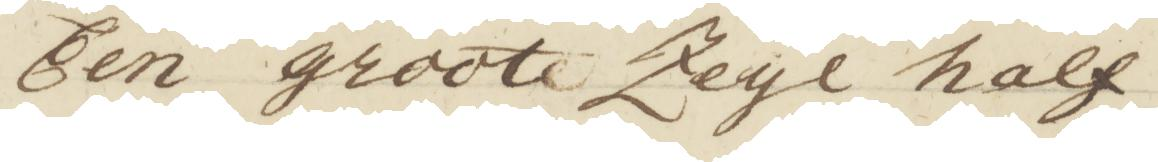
Een groote Zeijl half
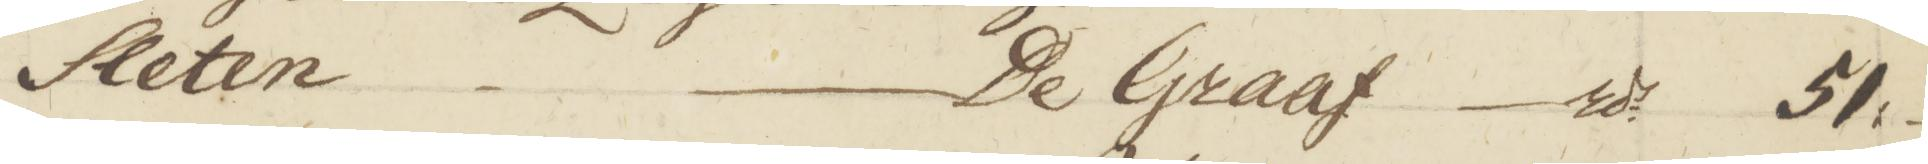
Sleten - — De Graaf — rd=s 51:
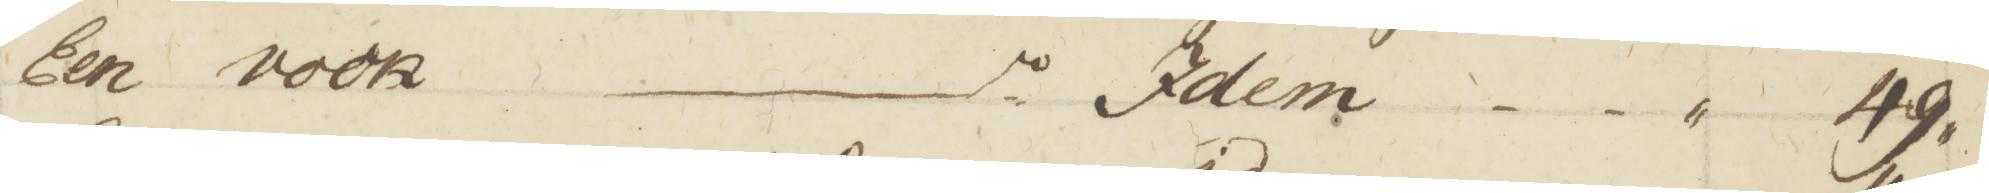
Een voor —_=o Idem - - „ 49,
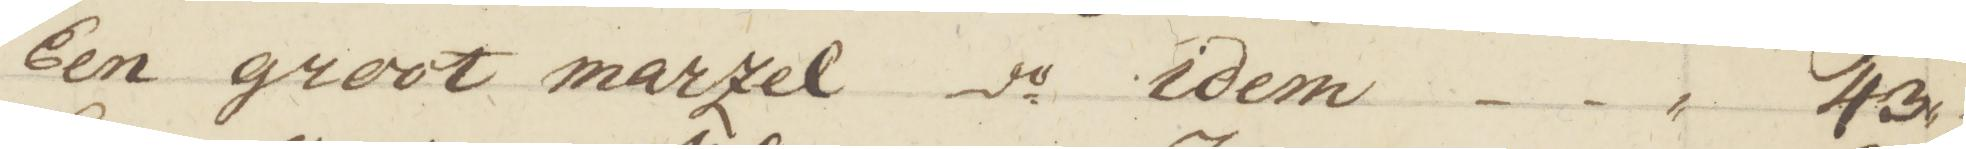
Een groot marzel _=o idem - - „ 43„
